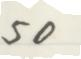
0
